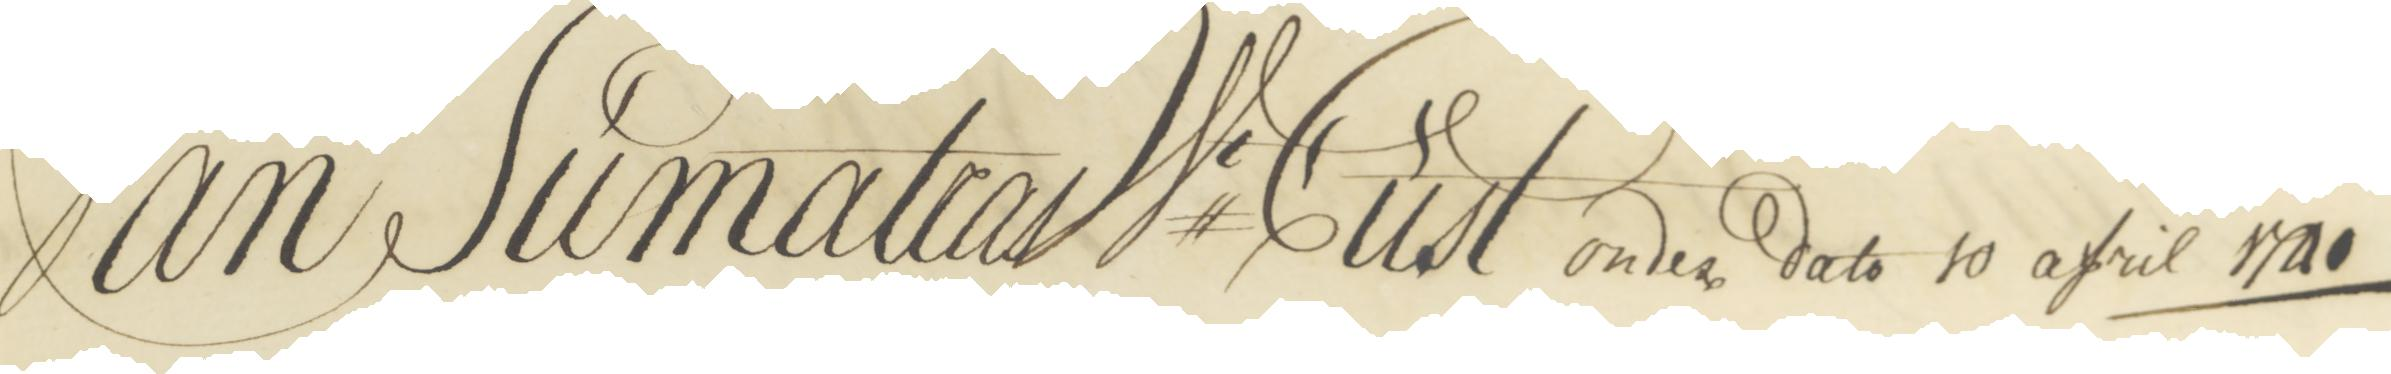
Van Sumatras W#t Cust onder dato 10 april 1720
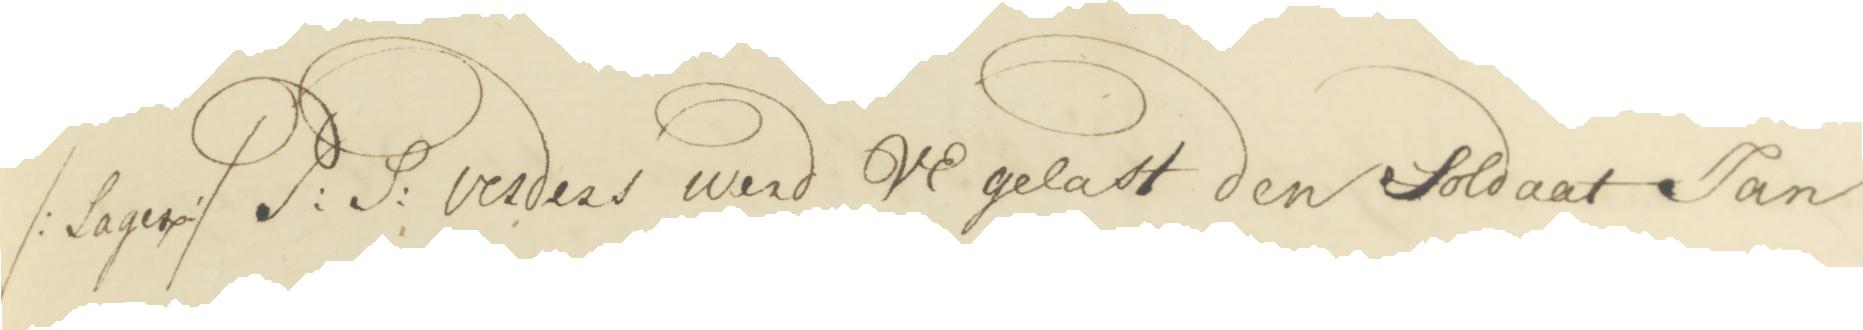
/:lager:/ P:S: verders werd VE gelast den soldaat Ian
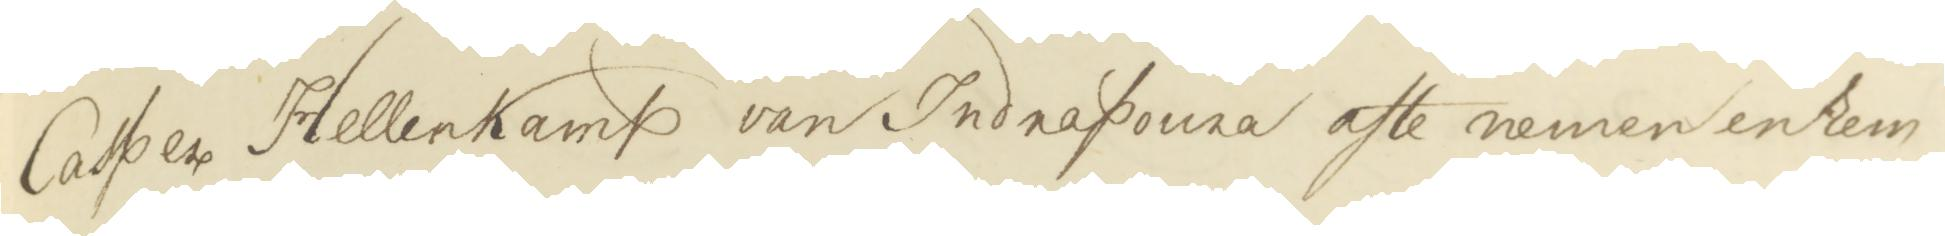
Casper Stellenkamp van Indrapoura afte nemen en hem
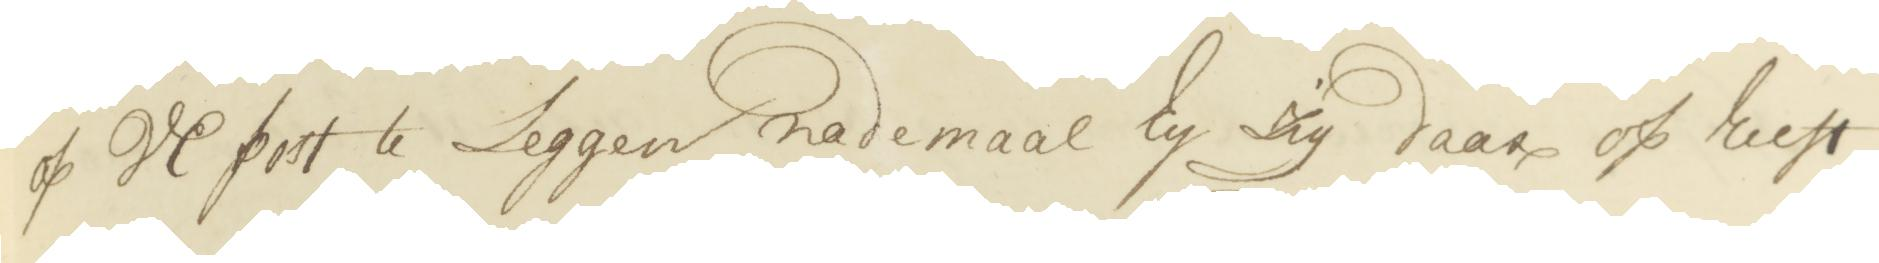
op VE post te leggen nademaal hy zig daar op heeft
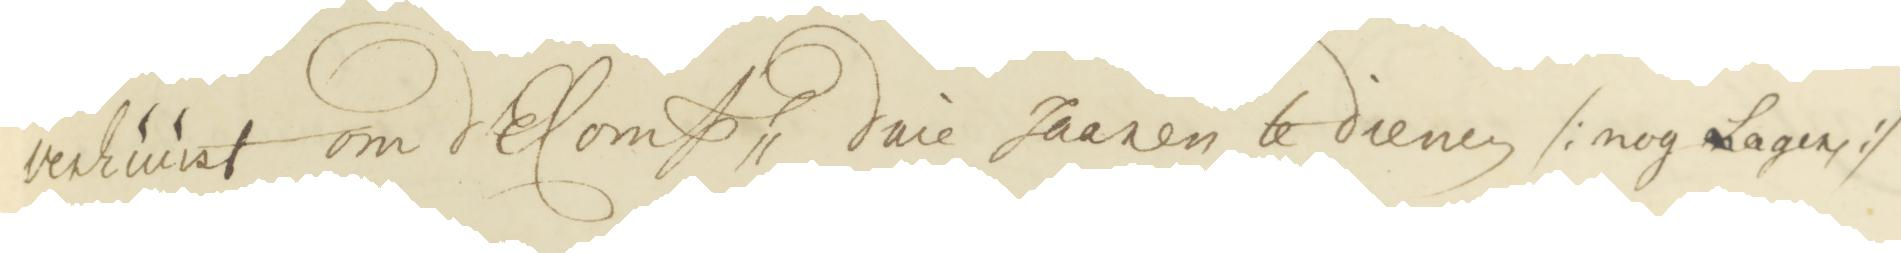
verhuurt om d’EComp„e drie jaaren te dienen /:nog lager:/
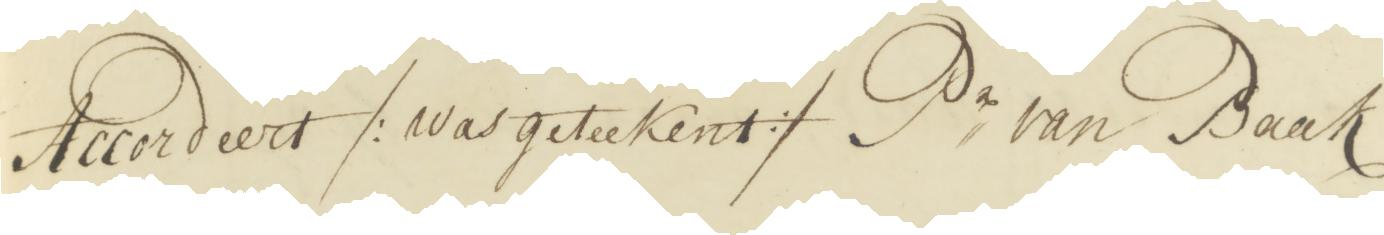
Accordeert /:was geteekent:/ P„r van Baak
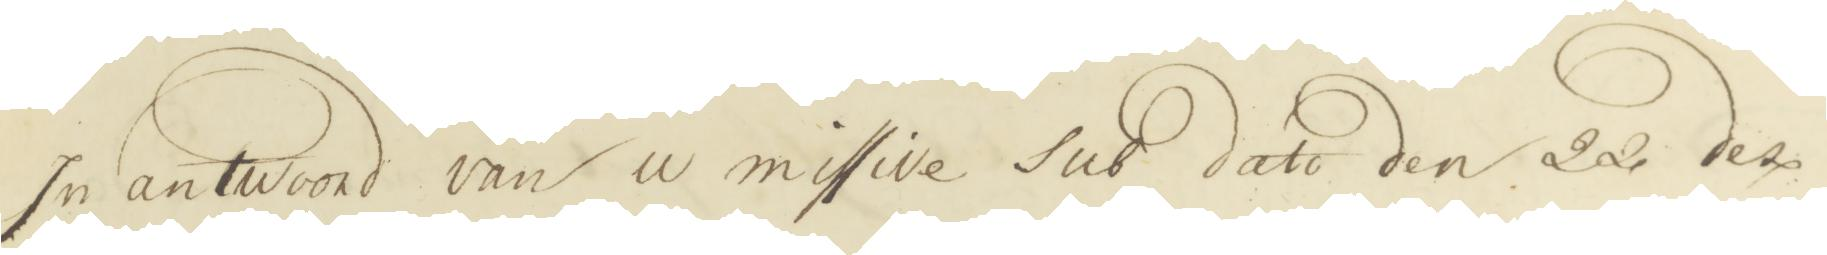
Jn antwoord van u missive sub dato den 22 dez
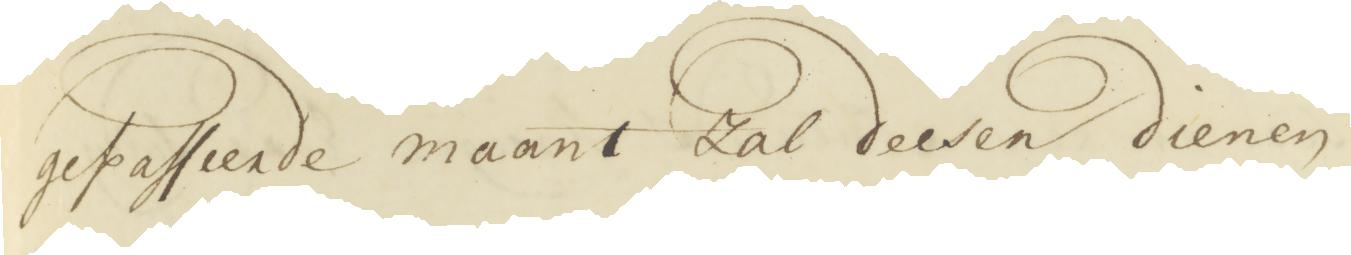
gepasseerde maant zal deesen dienen
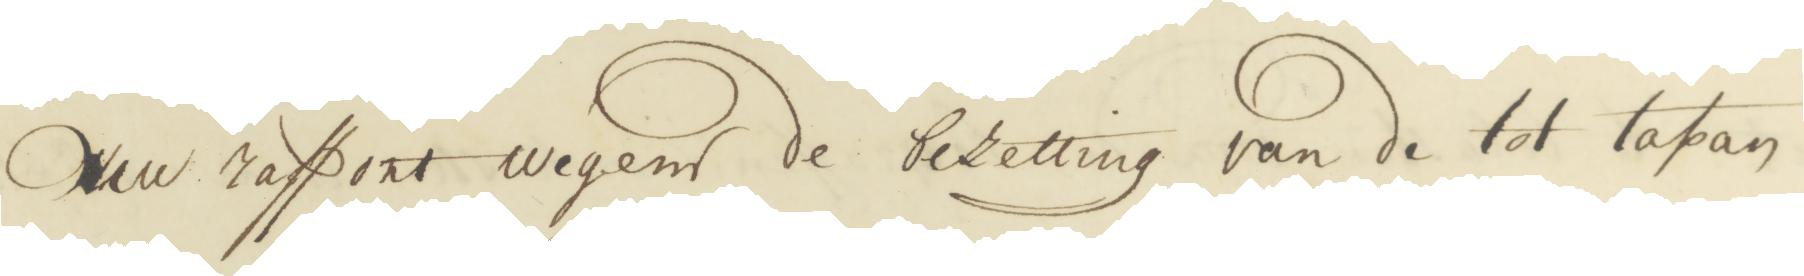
Uw rapport wegens de bezetting van de tot tapan
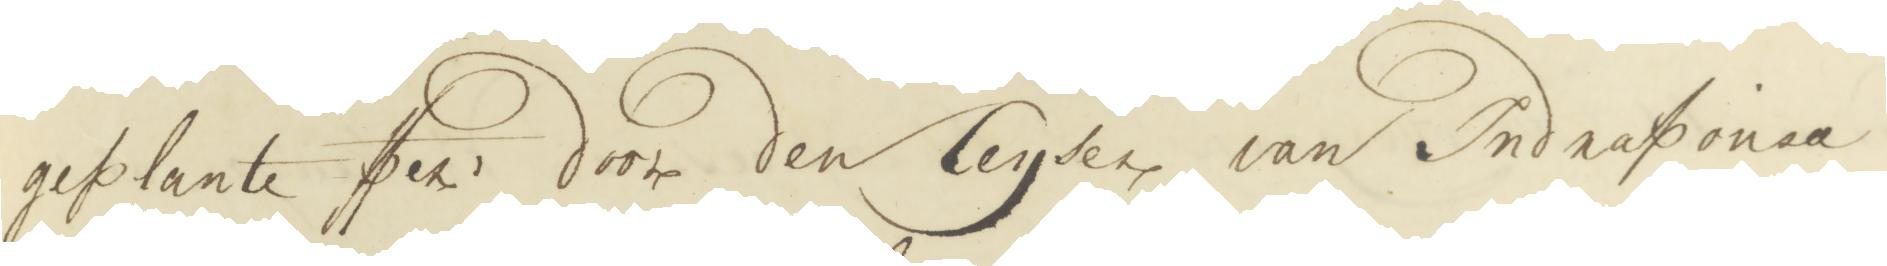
geplante pper: door den ceyser van Indrapoura
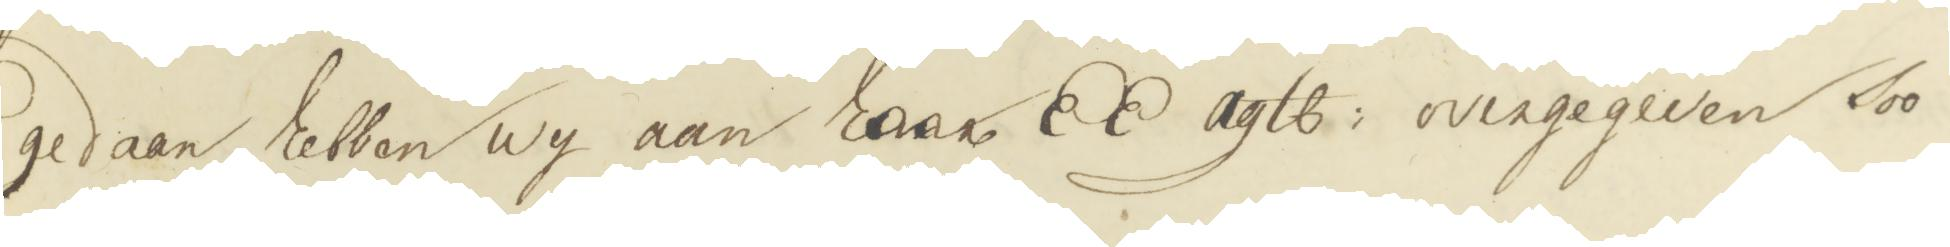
gedaan, hebben wy aan haar EE agtb: overgegeeen soo
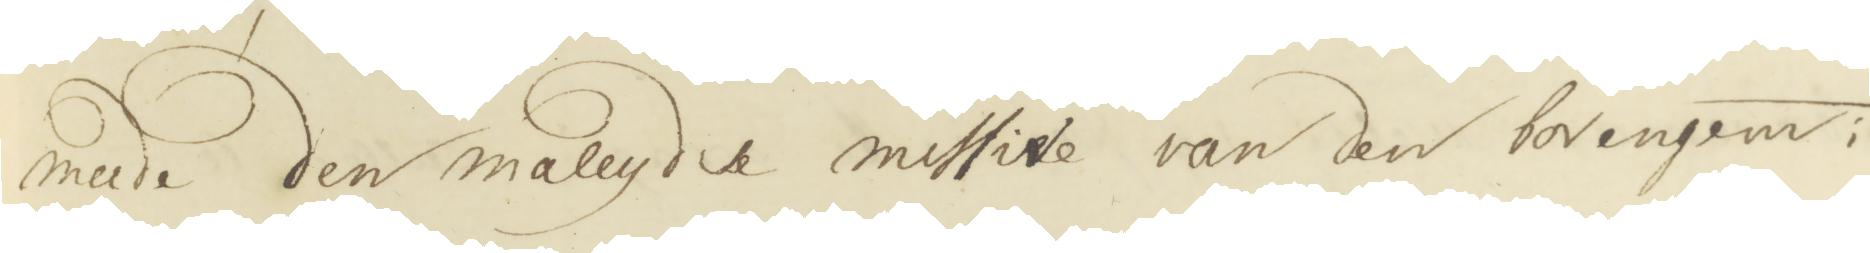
meede den maleijdse missive van den bovengem:
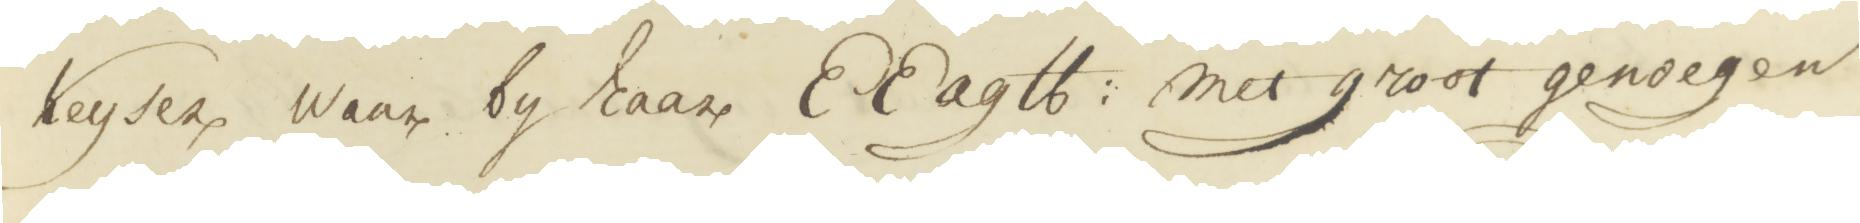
keijser waar by haar EE agtb: met groot genoegen
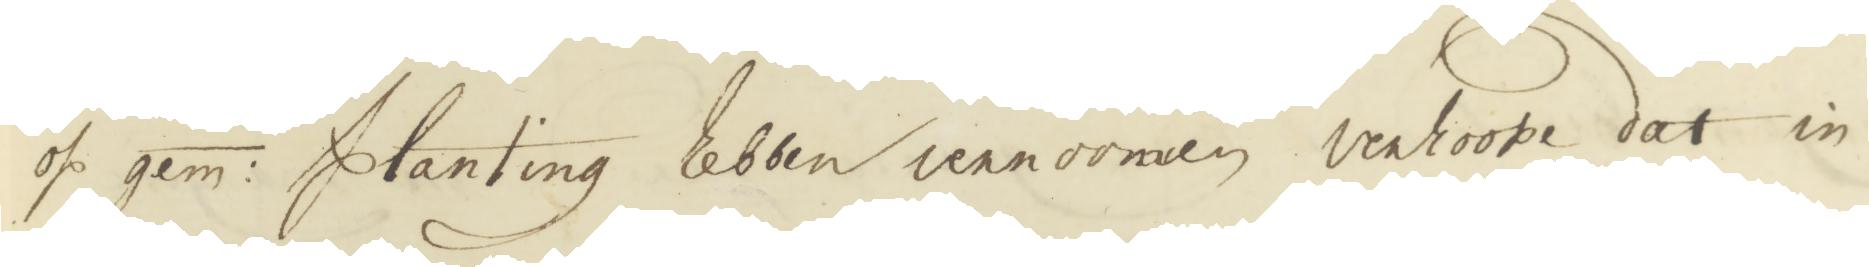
op gem: planting hebben vernoomen verhoope dat in
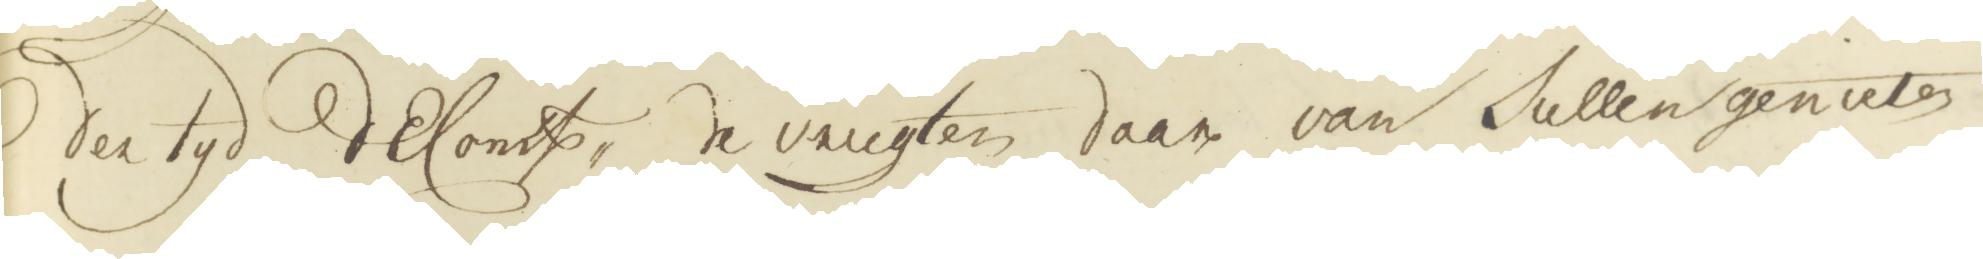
der tyd de Comp„ de vrugten daar van sullen genieten
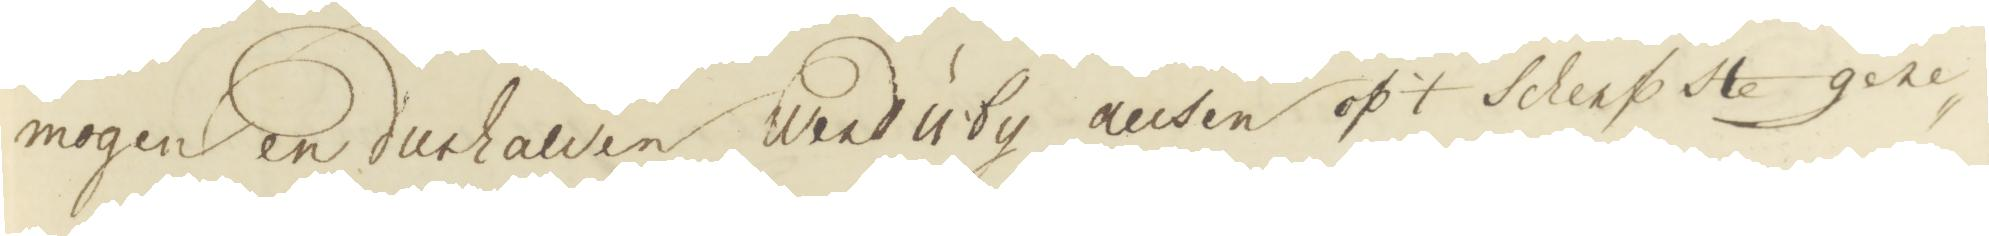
mogen en dierhalven werd u by deesen op ’t scherpste gere„
